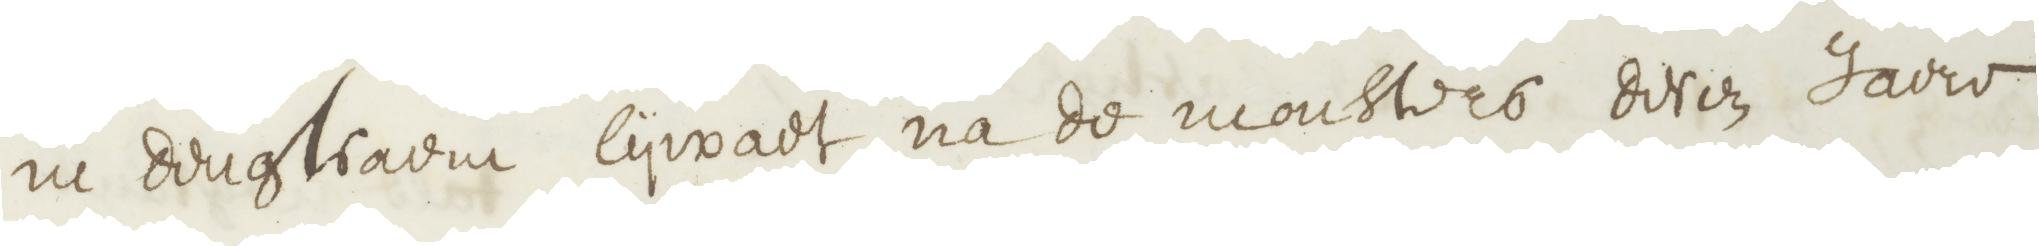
nu deugtsaem lijwaet na de monsters desen Iaere
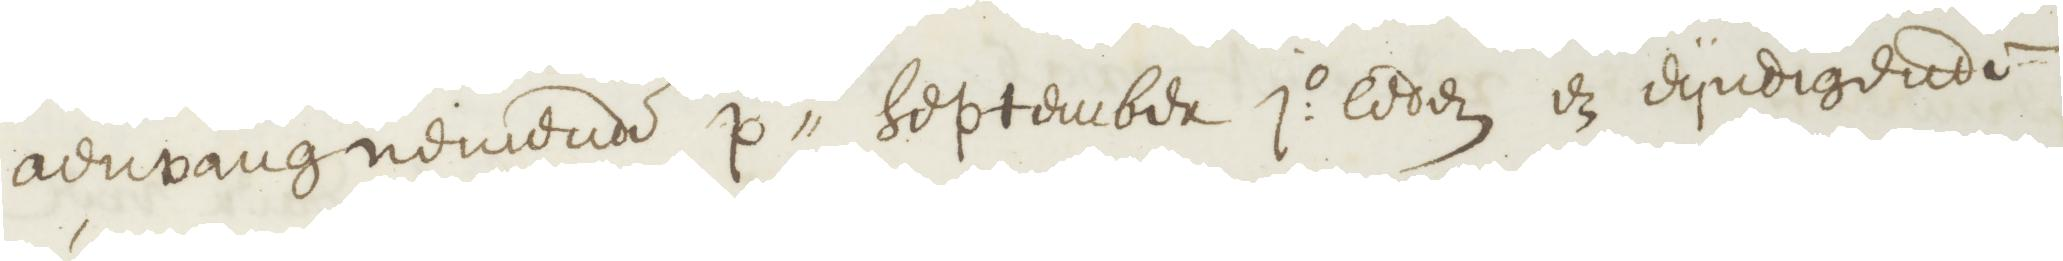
aenvang nemende p„mo september j:o leden en eijndigende
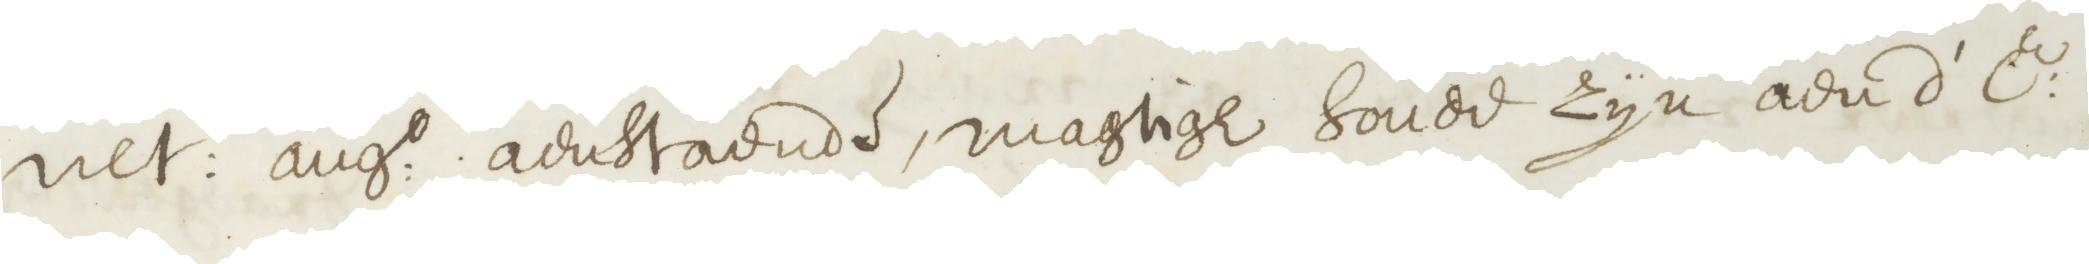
ult:o aug:o aenstaende, magtigh soude zijn aen d’ E:
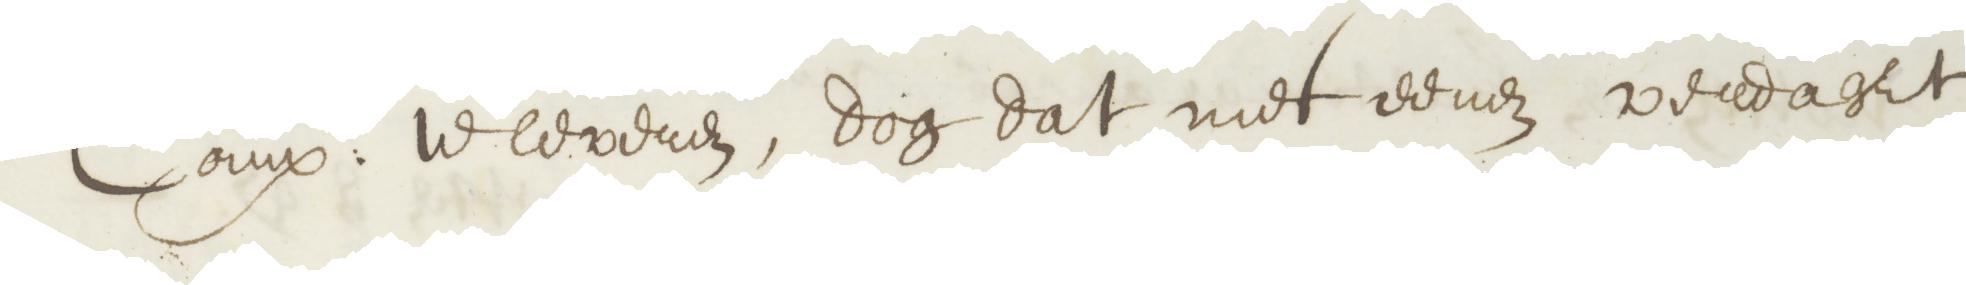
Comp: te leveren, dog dat met eenen verdaght
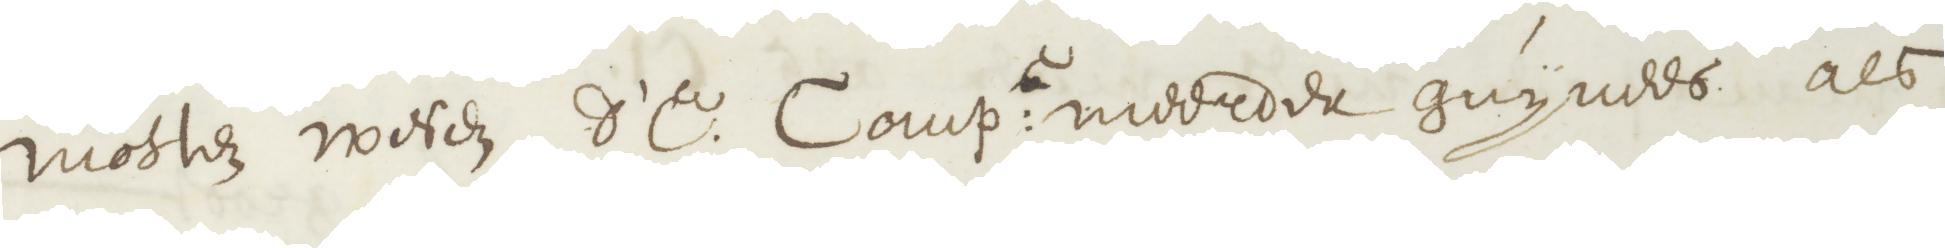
mosten wesen d ’E: Comp:s meerder guijnees als
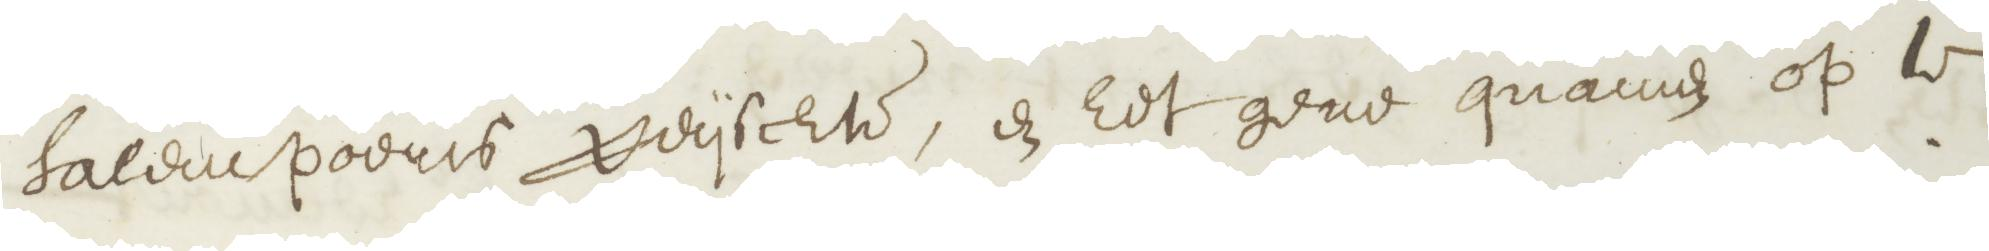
salempoeris vereijschte, en het gene quamen op te
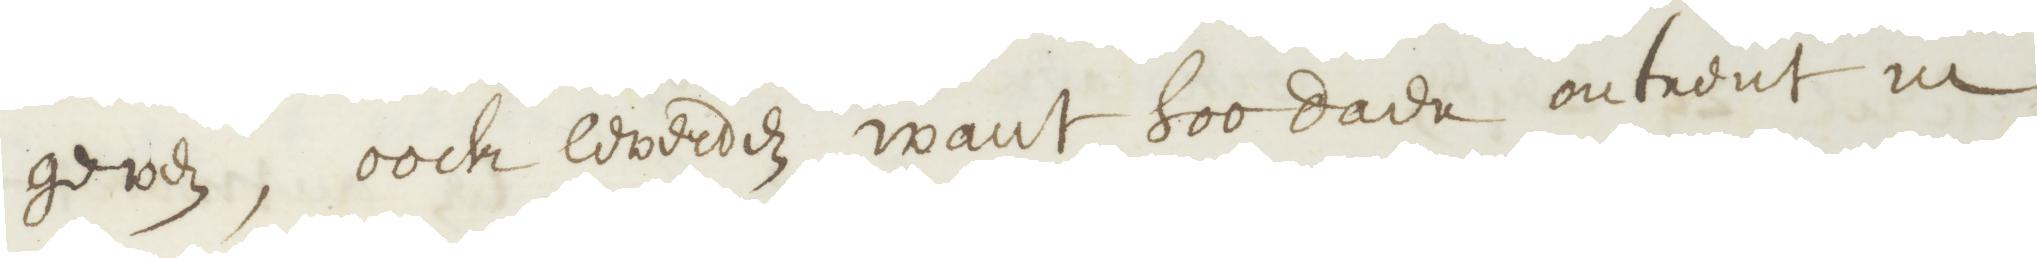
geven, oock leverden want soo daer ontrent in
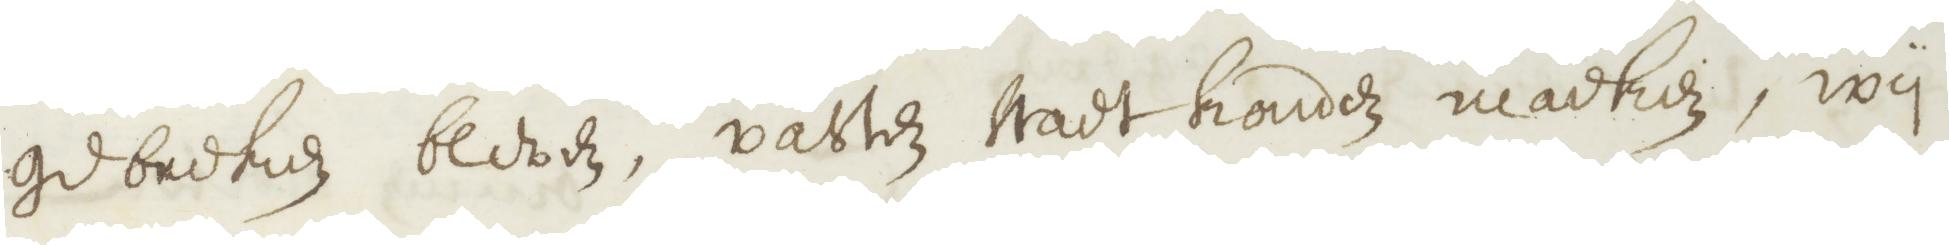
gebreken bleven, vasten staet konden maeken, wij
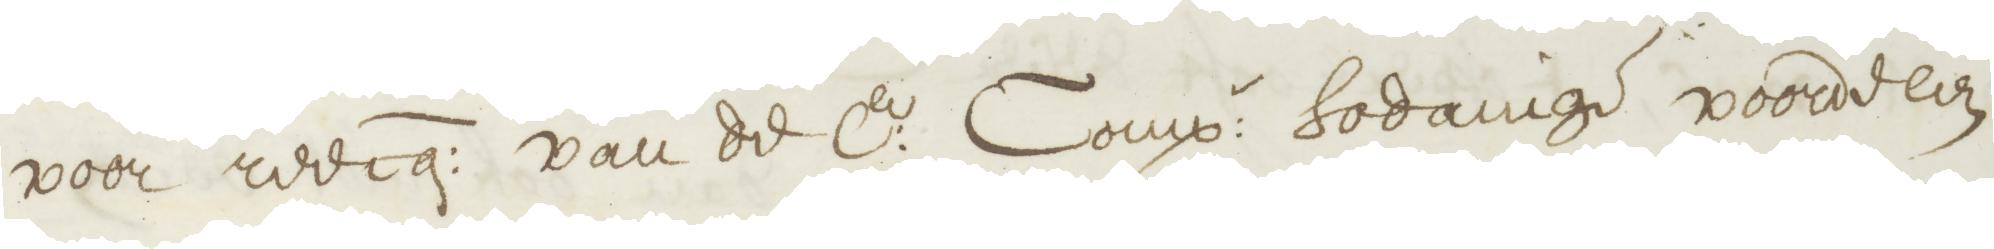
voor reecq: van de E: Comp: sodanige voordelen
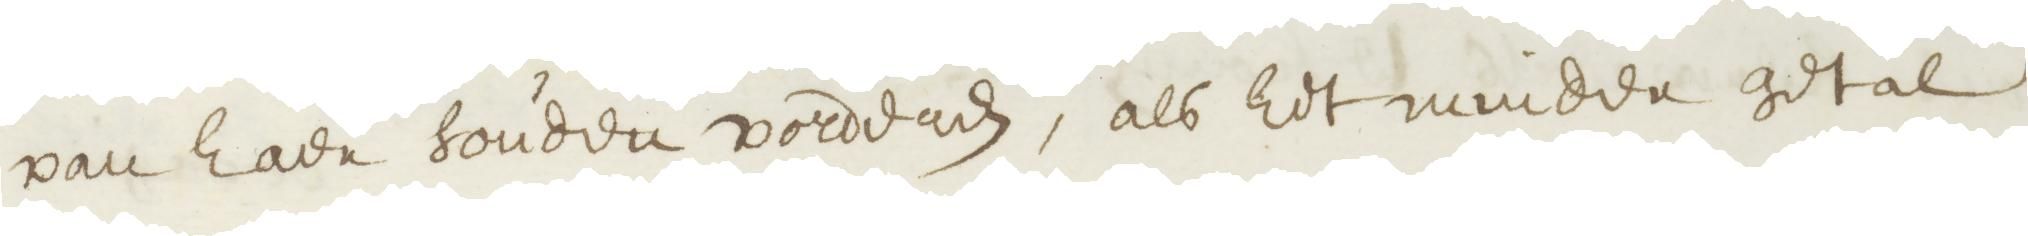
van haer souden vorderen, als het minder getal
